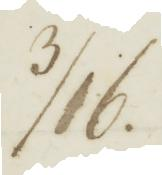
3/16.
